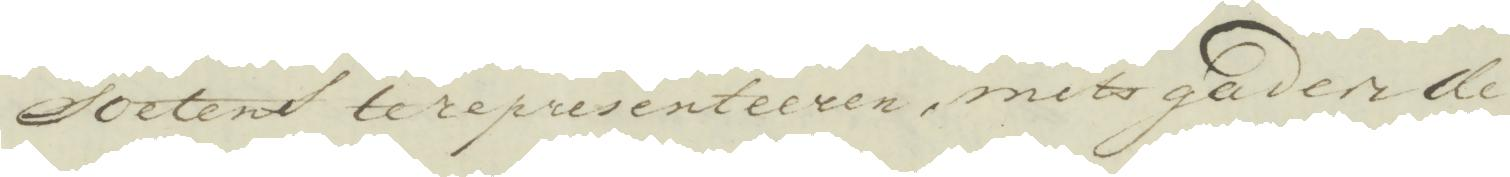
Soetens te representeeren, mitsgader de
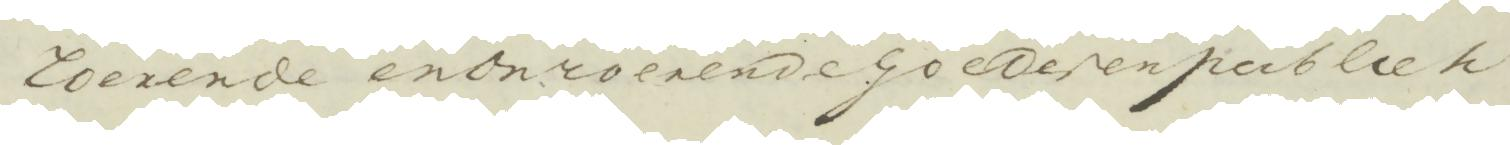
roerende en onroerende goederen publiek
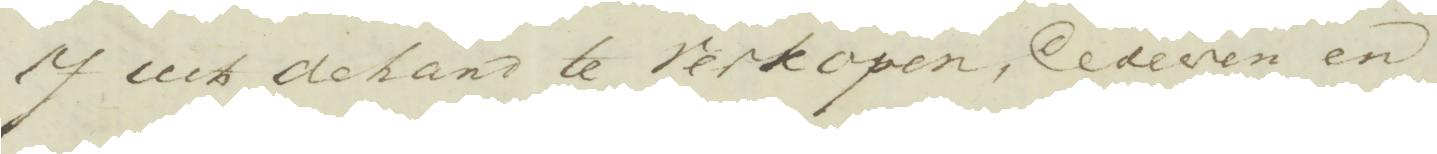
of uit dehand te Verkopen, Cederen en
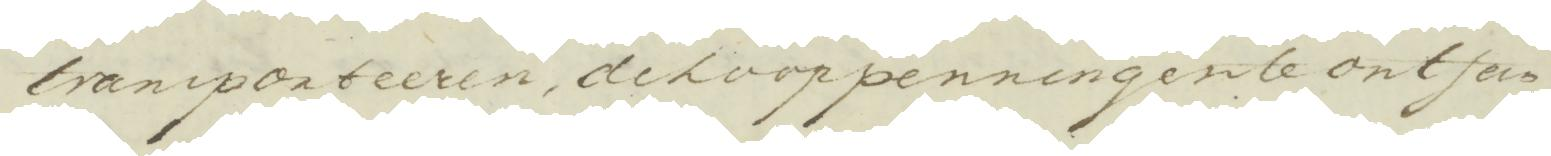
transporteeren, de kooppenningen te ontfan
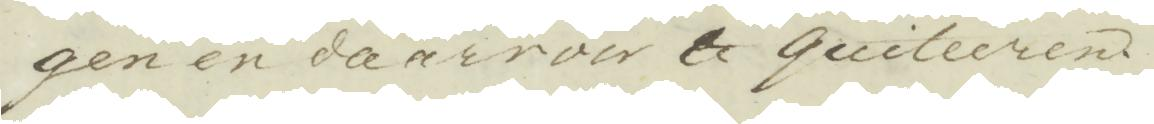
gen en daarvoor te quiteeren
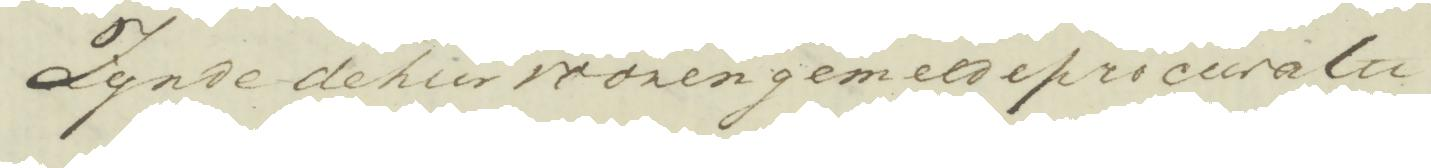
Zynde de hier vooren gemelde procuratie
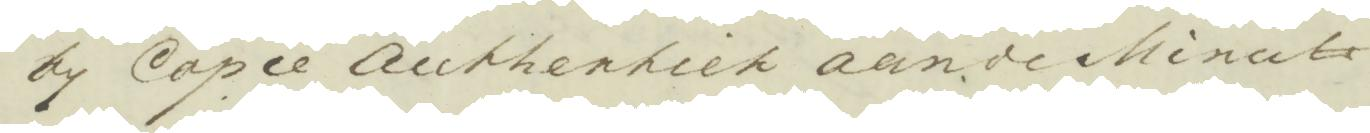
by Copie Authentiek aan de Minute
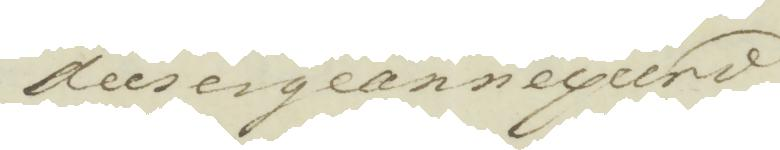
deeser geanneexeerd
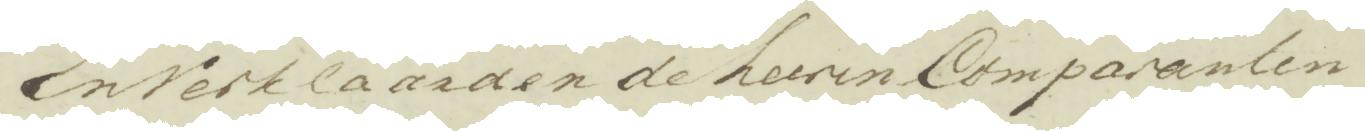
En Verklaarden de heeren Comparanten
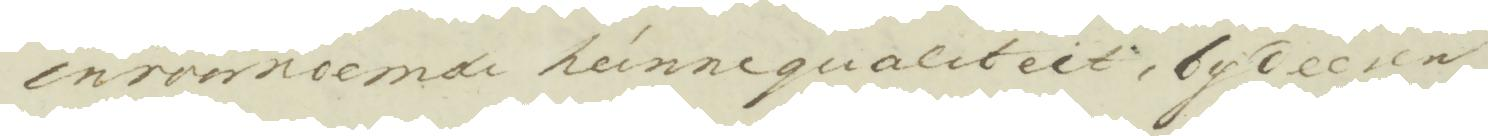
in voornoemde hunne qualiteit, by deesen
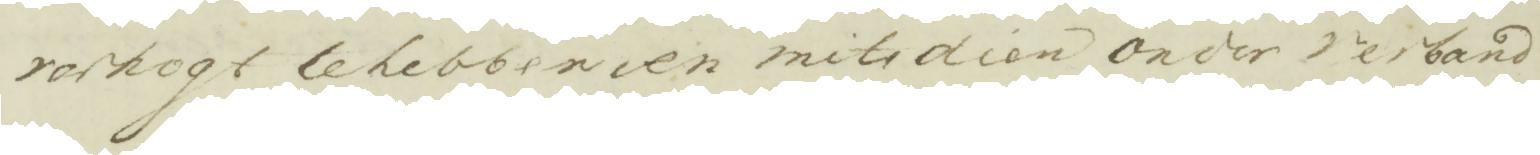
verkogt te hebben en mitsdien onder verband
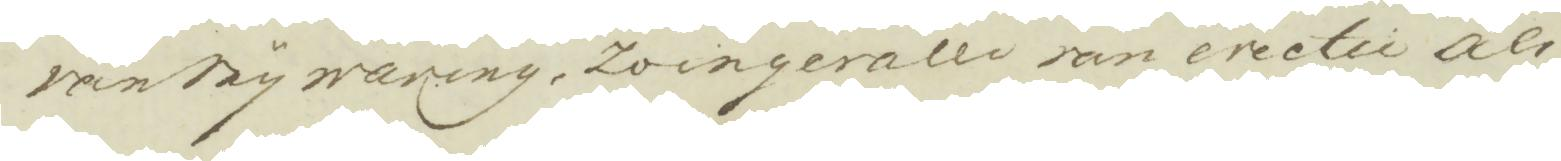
van vry waring, zo ingevalle van erectie als
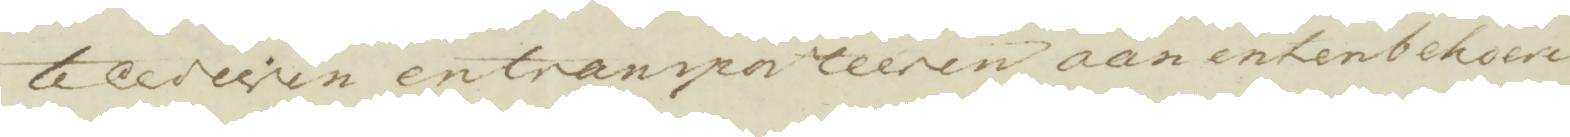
te cedeeren en transporteeren aan en ten behoeve
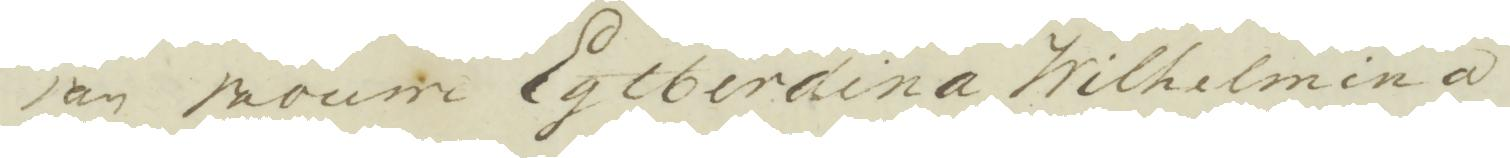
van Vrouwe Egtberdina Wilhelmina
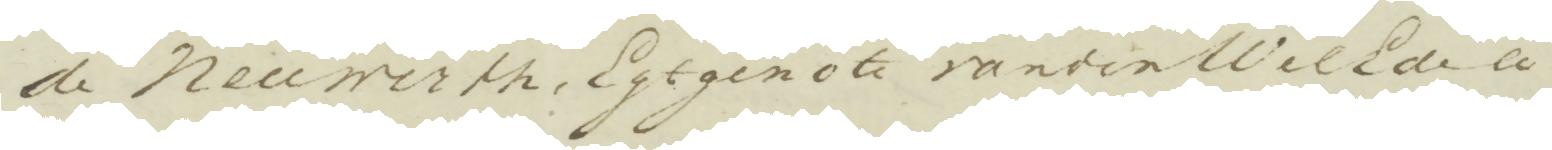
de Neuwirth, Egtgenote van den Wel Edele
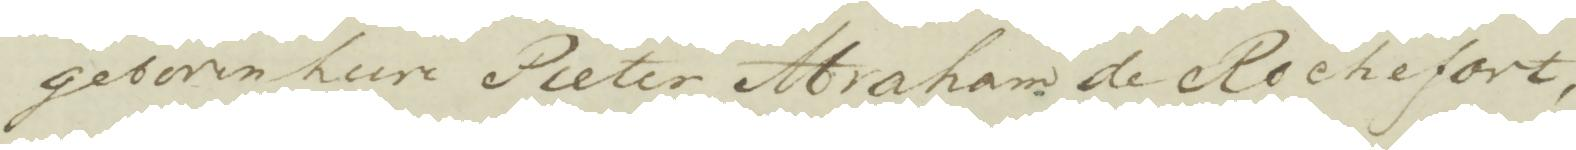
geboren heer Pieter Abraham de Rochefort,
